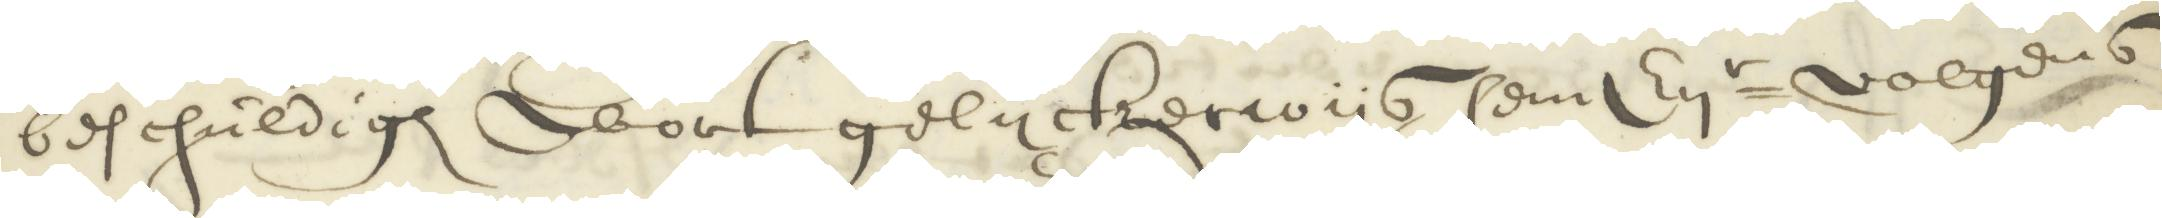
beschuldigh wort gelyckerwijs hem Ey=r volgens
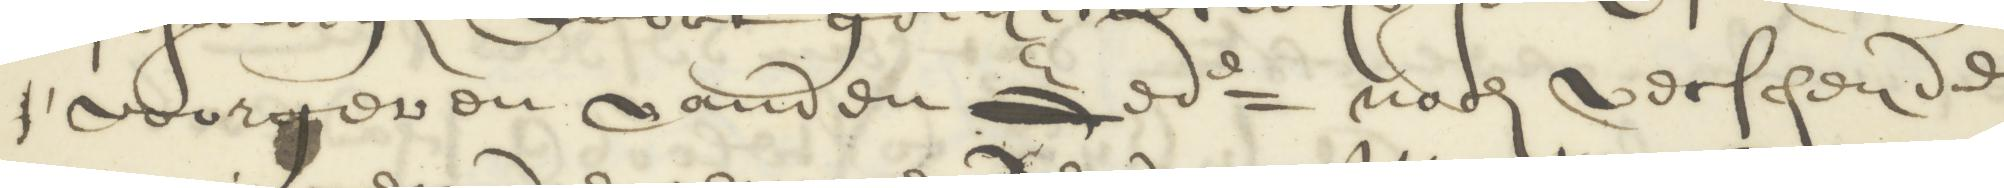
t' voorgeven vanden Ged=e nade verscheyde
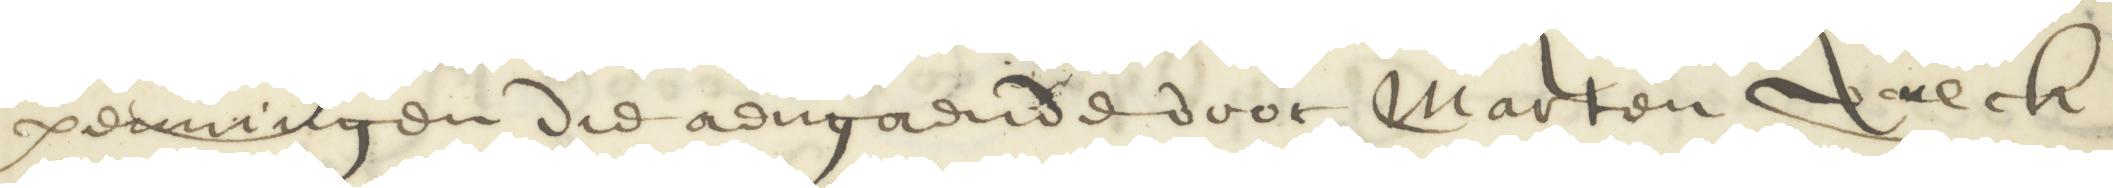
penningen die aengaende door marten valck
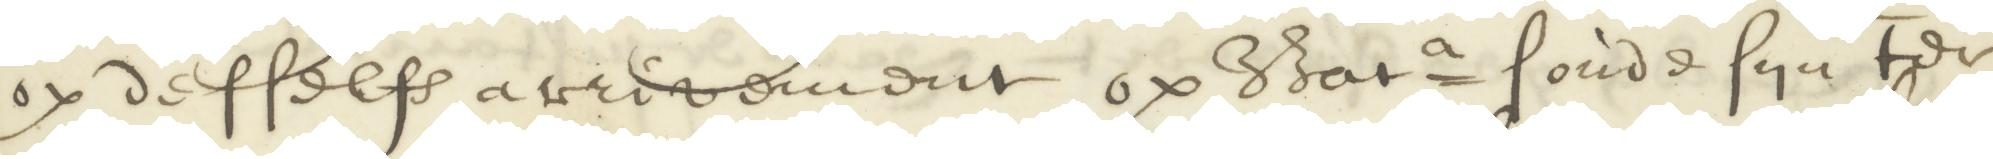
op desselfs arrivement op Bat=a soude syn ter
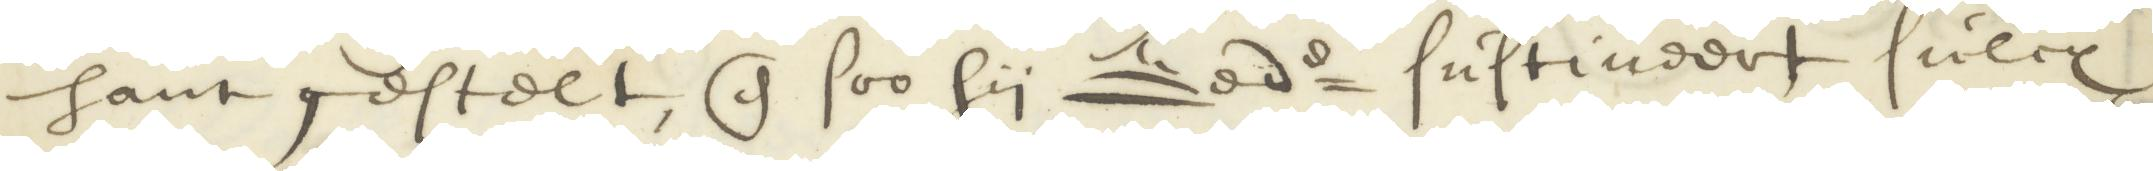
hant gestelt, ende soo hij Ged=e sustineert sulcx
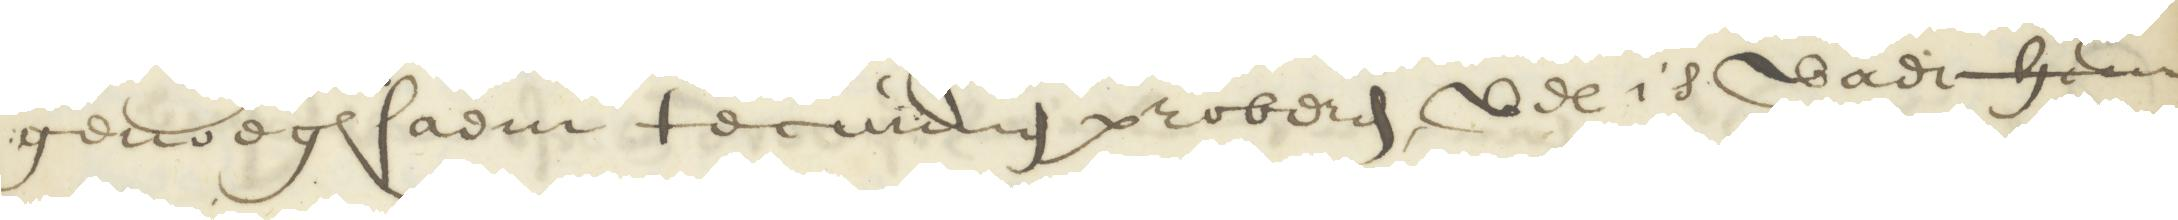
genoeghsaem te cunnen proberen, wel is waer hem
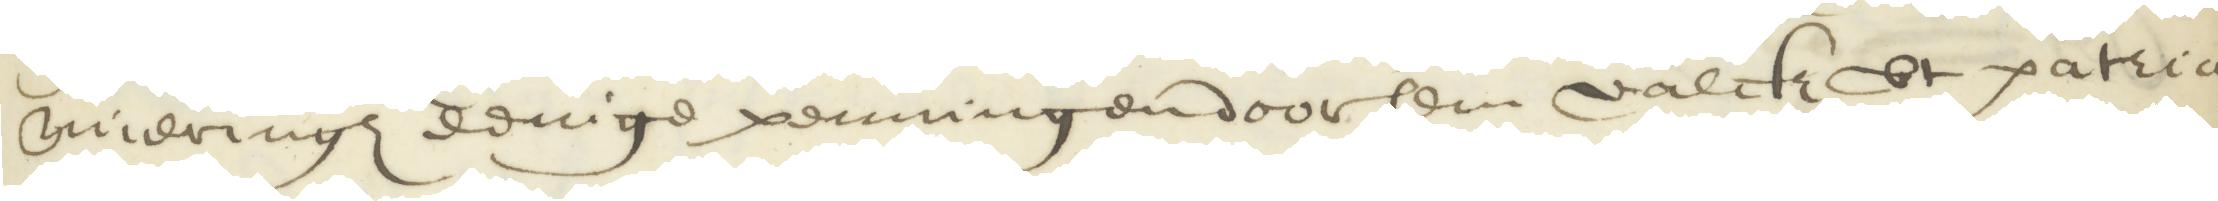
mieringh eenige penningen door hem valck wt patria
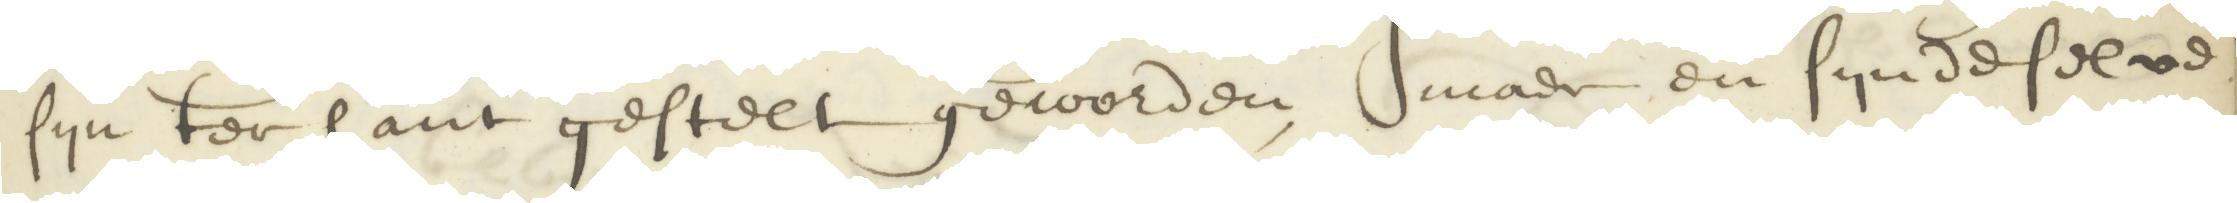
syn ter hant gestelt geworden, maer en syn deselve
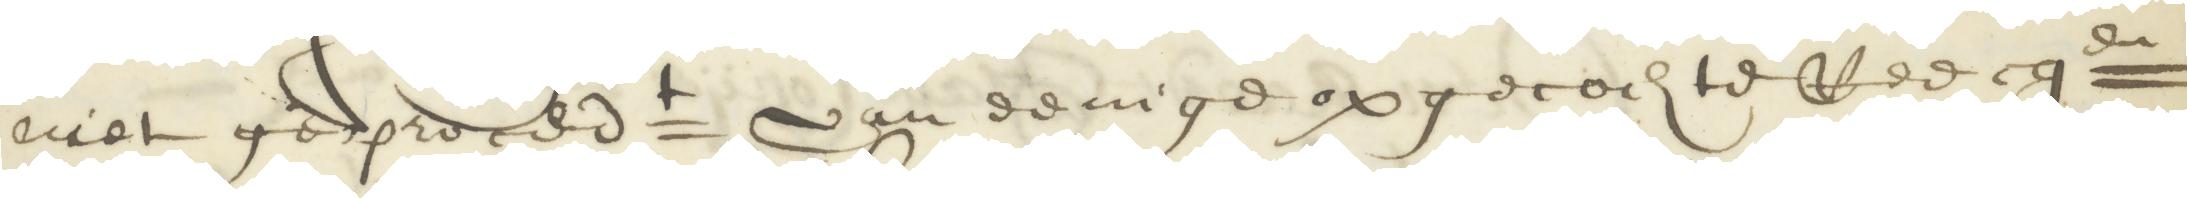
niet geproced=t van eenige opgecochte Reecq=e
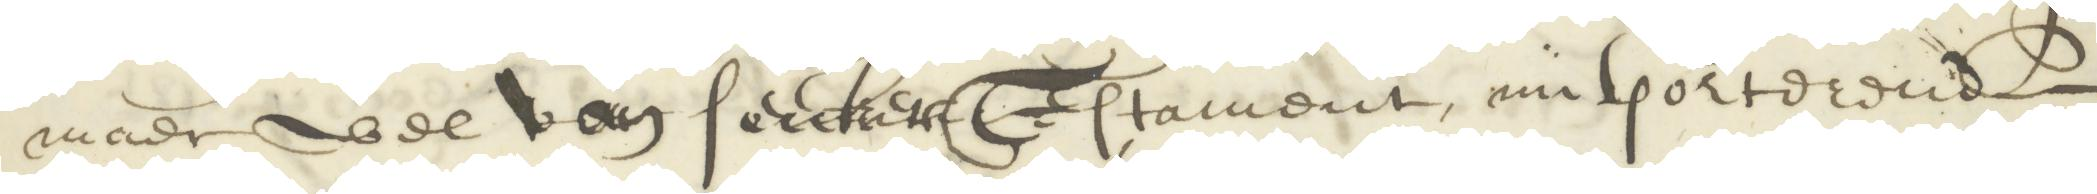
maer wel van seecker Testament, importerend
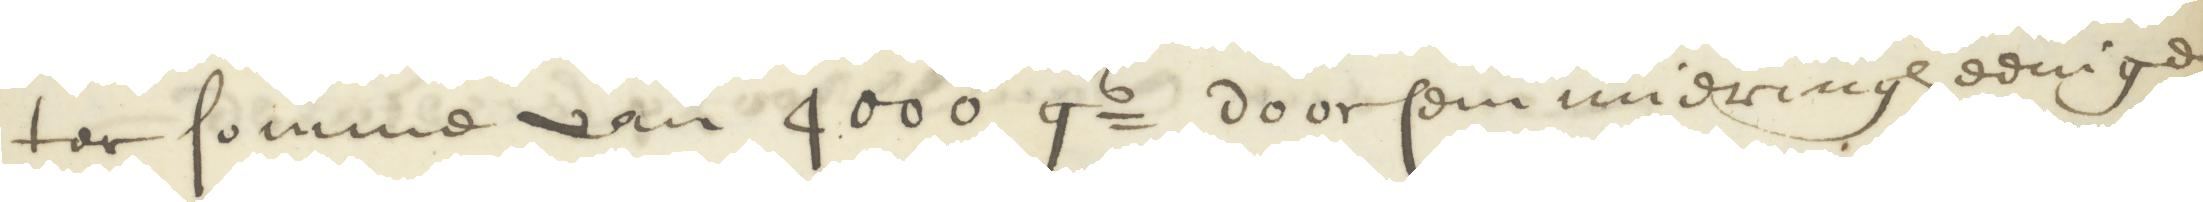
ter somme van 4000 g=s door hem mieringh eenige
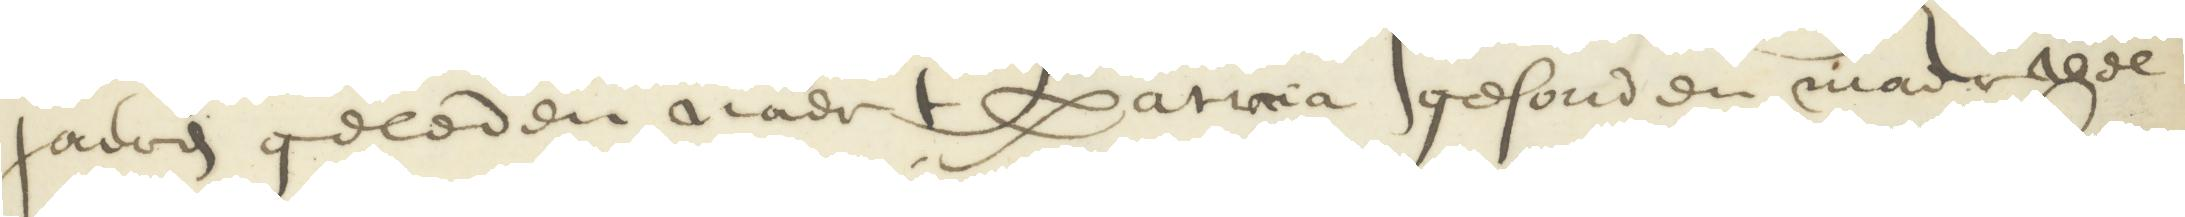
jaeren geleden naer t patria gesonden maer wel
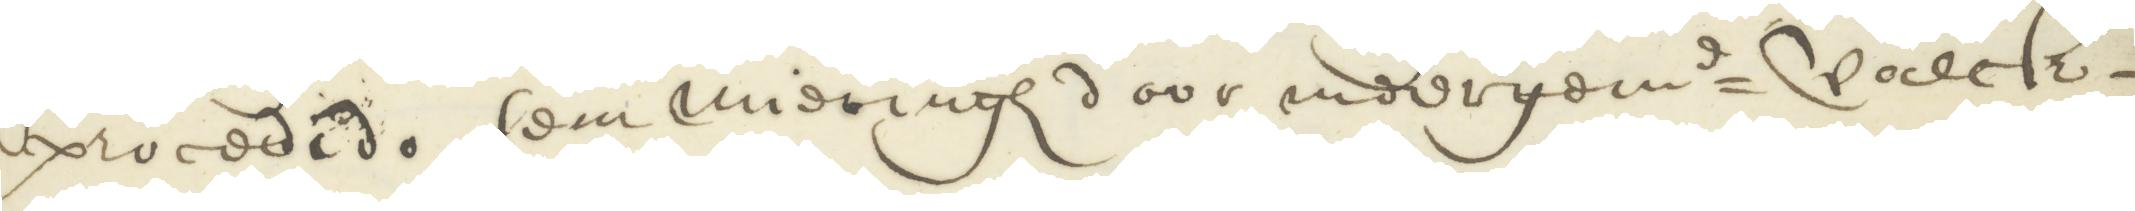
procedido hem mieringh door ondergem=e valck
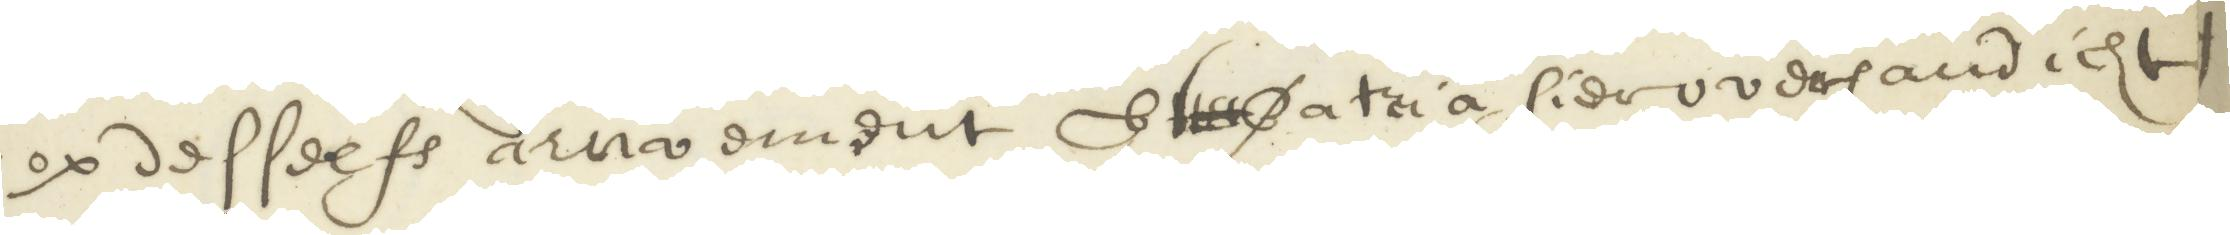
op desselfs arrivement b wt patria hier overhandicht
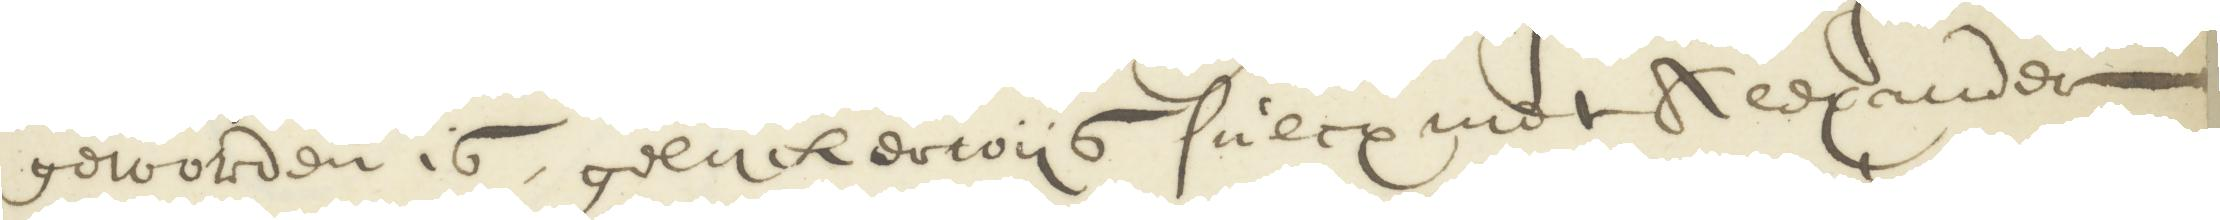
geworden is, gelyckerwijs sulcx met Alexander
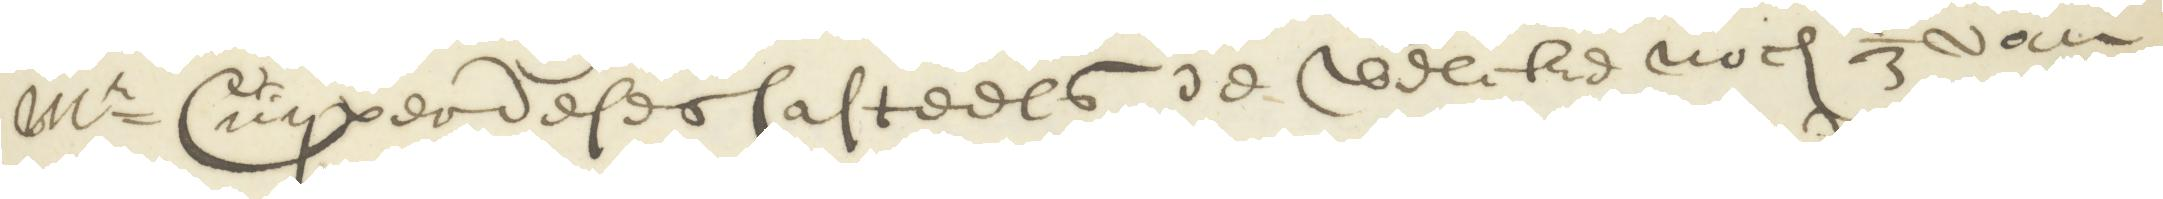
M=r Cuyper deses casteels de welcke noch 1/3 van
